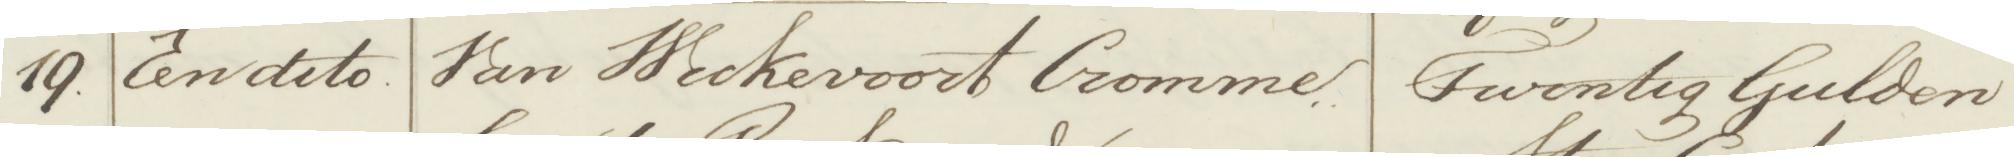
19. Een dito Van Weckevoort Cromme, Twintig Gulden
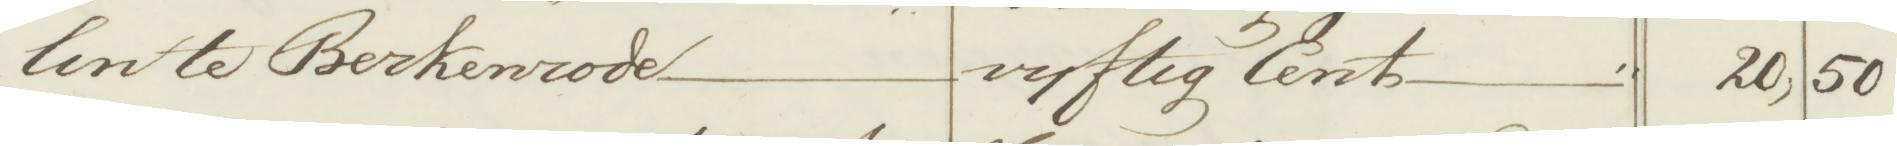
lin te Berkenrode vyftig Cent „ 20; 50
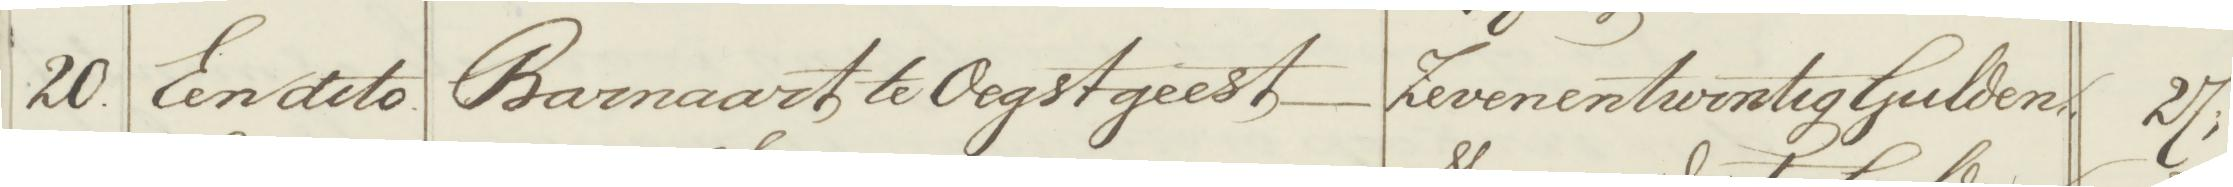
20. Een dito. Barnaart te Oegstgeest Zevenentwintig Gulden „ 27;
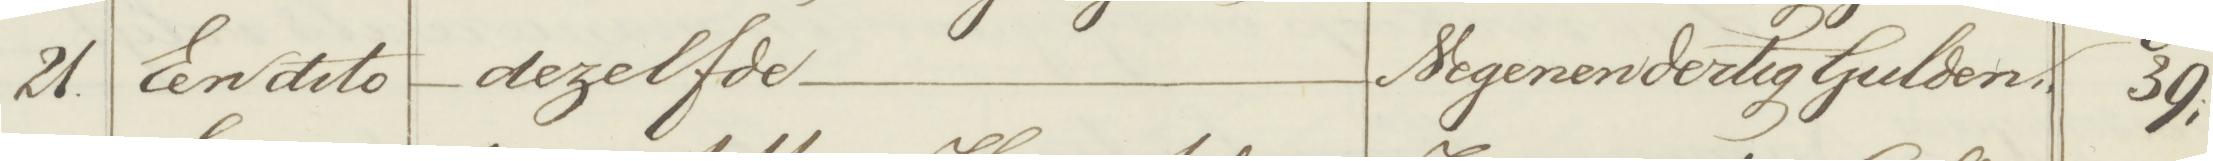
21. Een dito dezelfde Negenendertig Gulden „ 39;
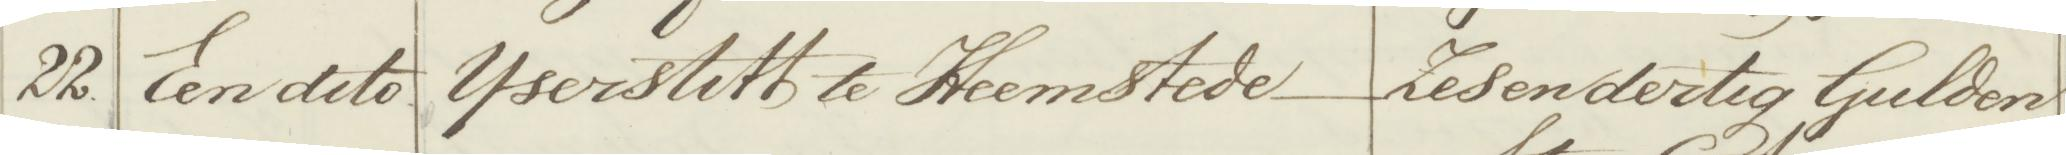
22. Een dito. Yserstitt te Heemstede Zesendertig Gulden
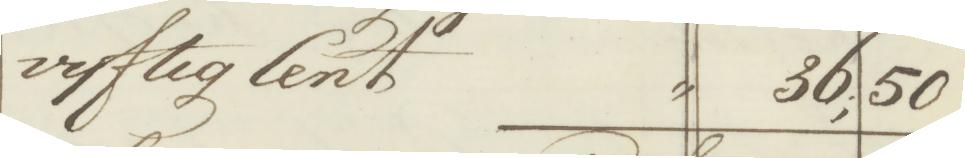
vyftig Cent „ 36, 50
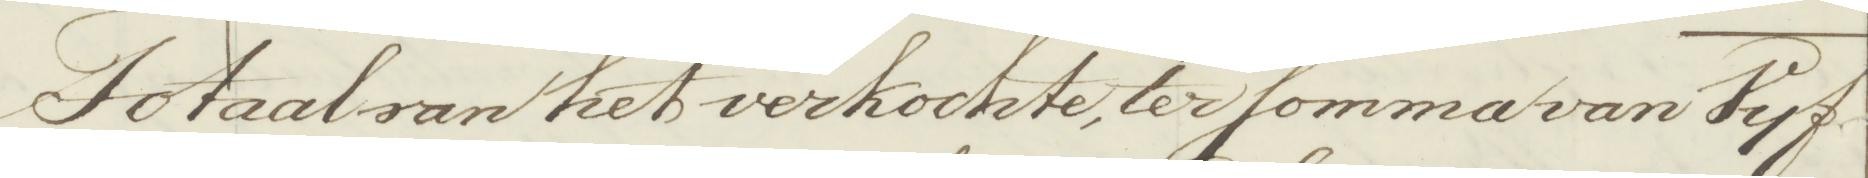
Totaal van het verkochte, ter somma van Vyf
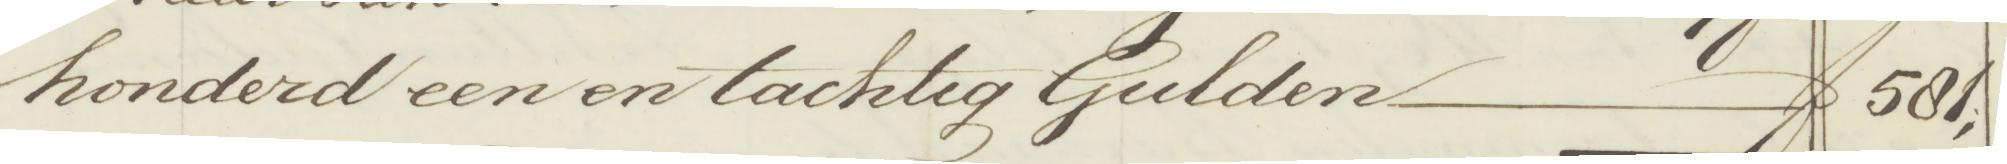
honderd een en tachtig Gulden ƒ581;
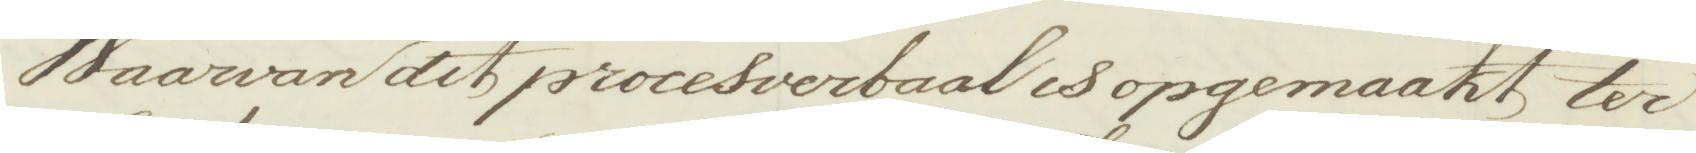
Waarvan dit procesverbaal is opgemaakt ter
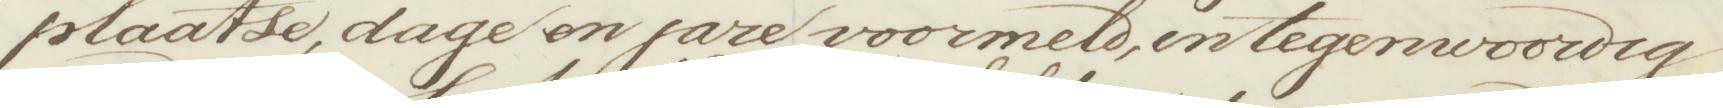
plaatse, dage en jare voormeld, in tegenwoordig
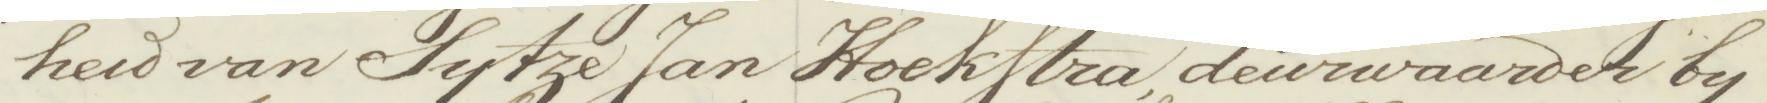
heid van Sytze Jan Hoekstra deurwaarder by
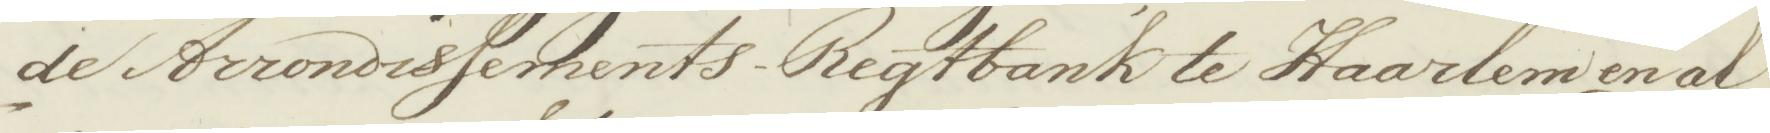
de Arrondissements-Regtbank te Haarlem en al
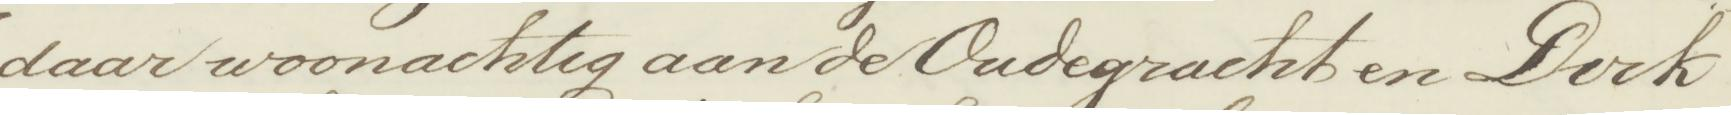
daar woonachtig aan de Oudegracht en Dirk
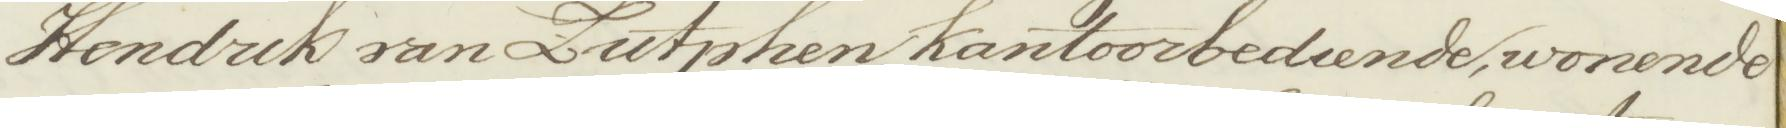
Hendrik van Zutphen, kantoorbediende, wonende
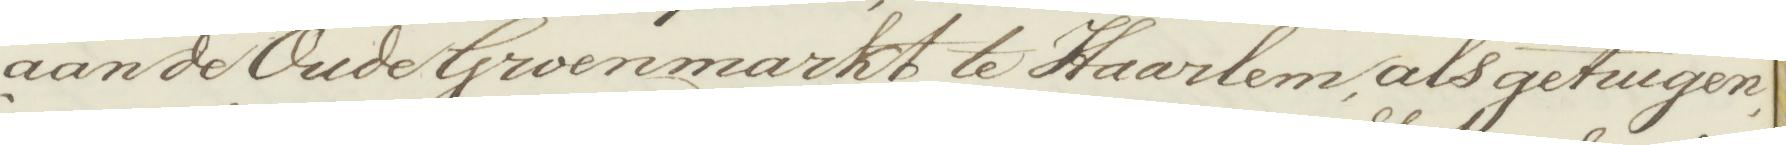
aan de Oude Groenmarkt te Haarlem, als getuigen,
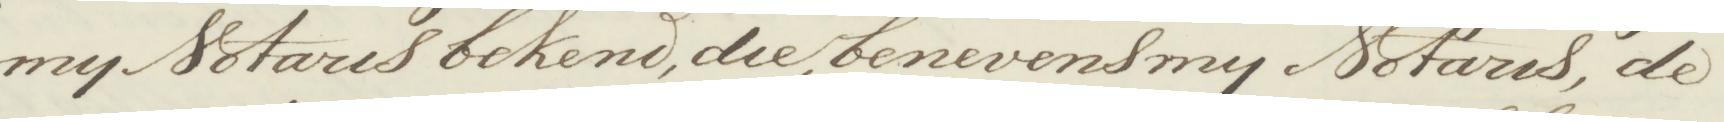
my Notaris bekend, die, benevens my Notaris, de
